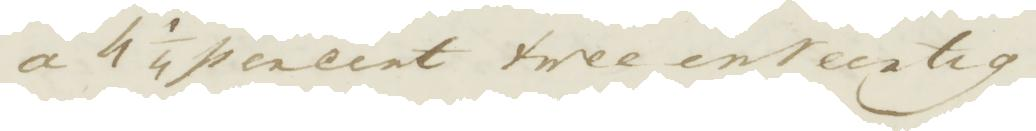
a 4¼ percent twee en veertig
